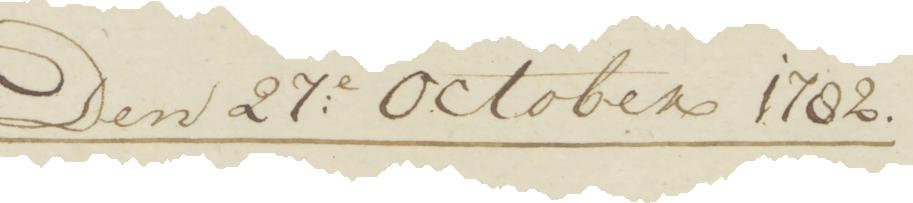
Den 27:e October 1782.
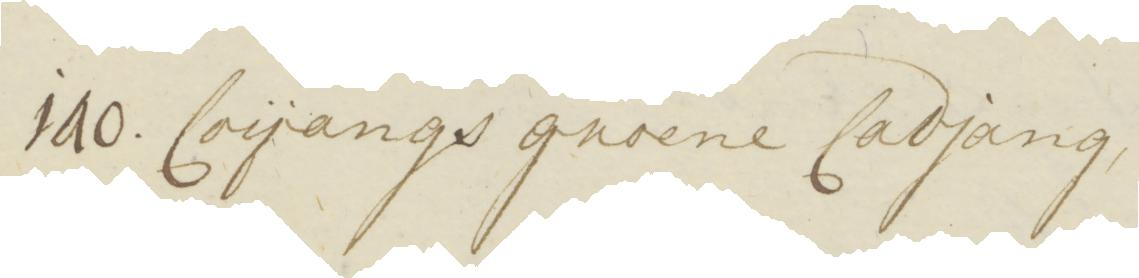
140. Coijangs groene Cadjang,
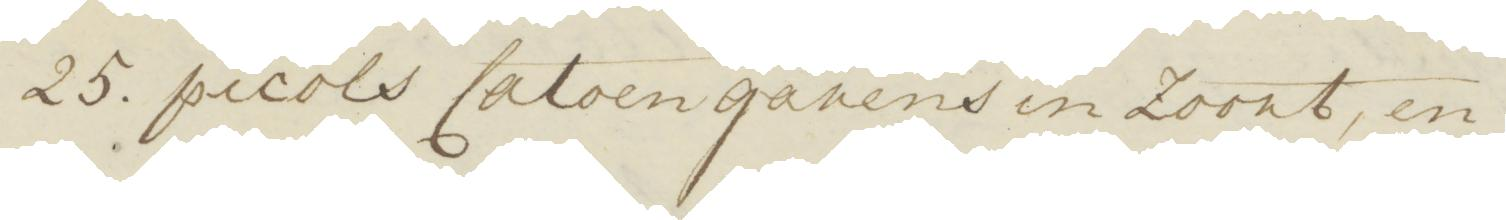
25. picols Catoengarens in zoort, en
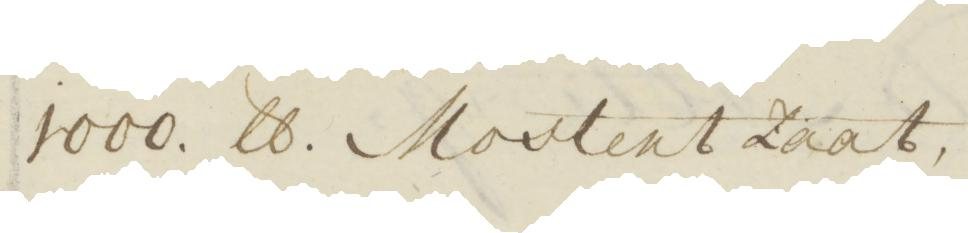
1000. lb. Mostert zaat,
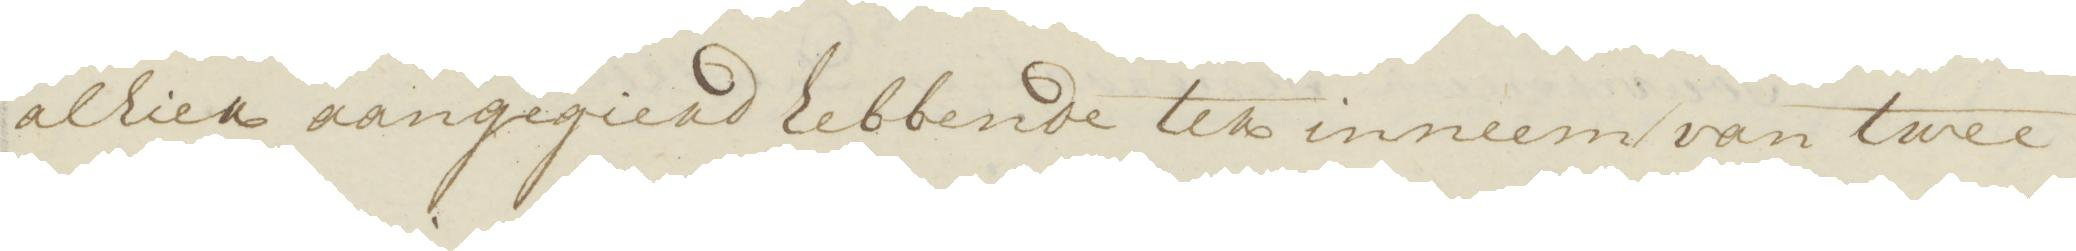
alhier aangegierd hebbende ter inneem van twee
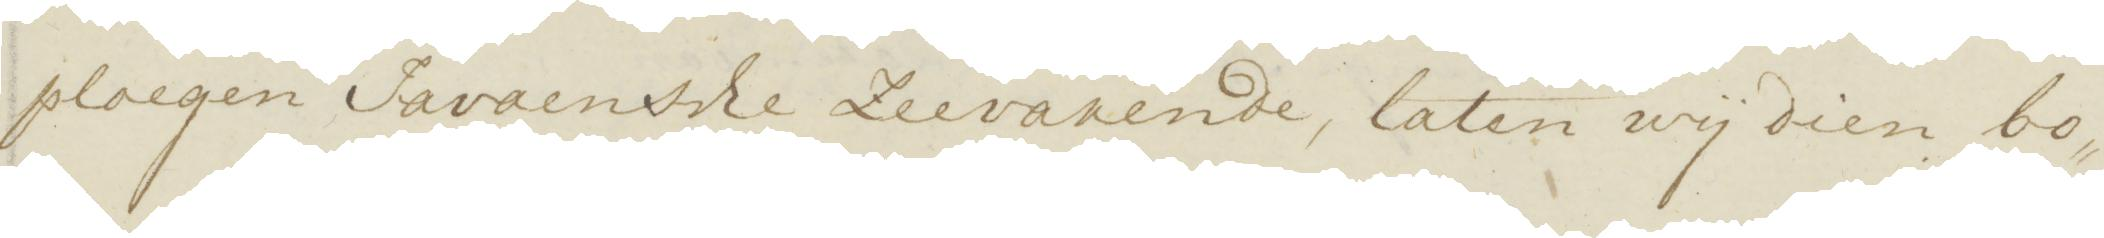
ploegen Javaensche zeevarende, laten wij dien bo„
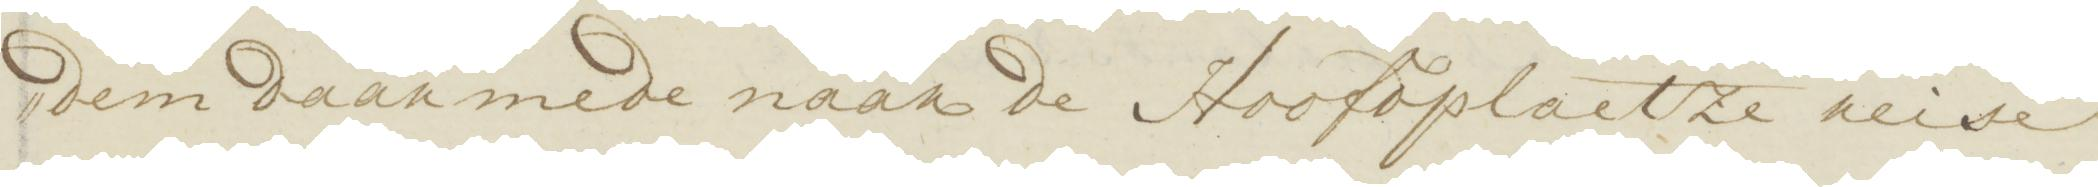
„dem daar mede naar de Hoofdplaetze reise
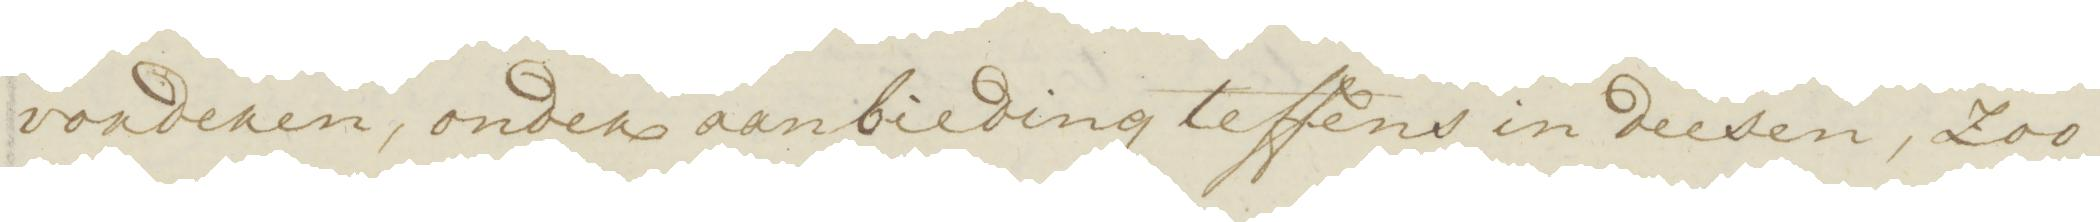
vorderen, onder aanbieding teffens in deesen, zoo
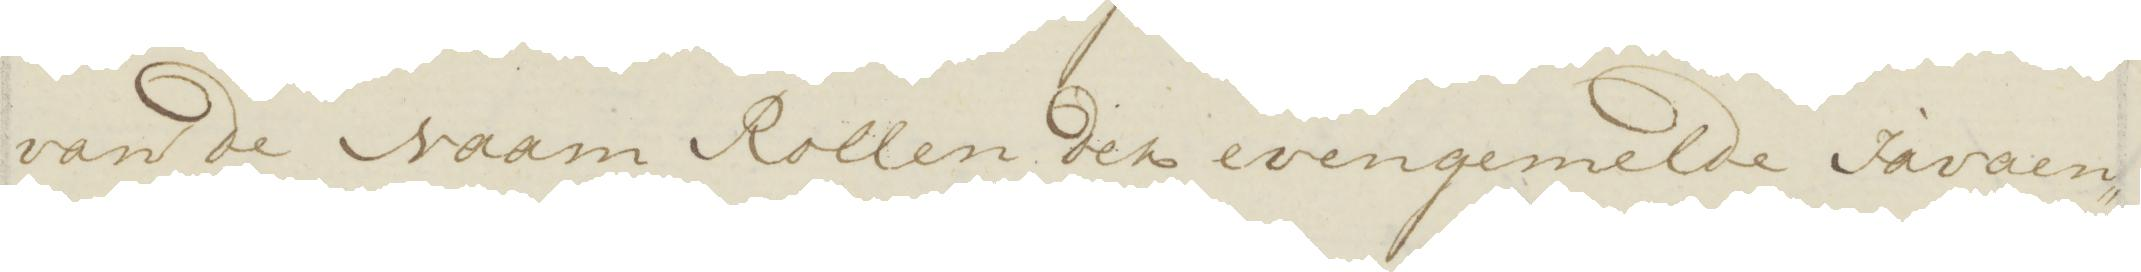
van de Naam Rollen der evengemelde Javaen„
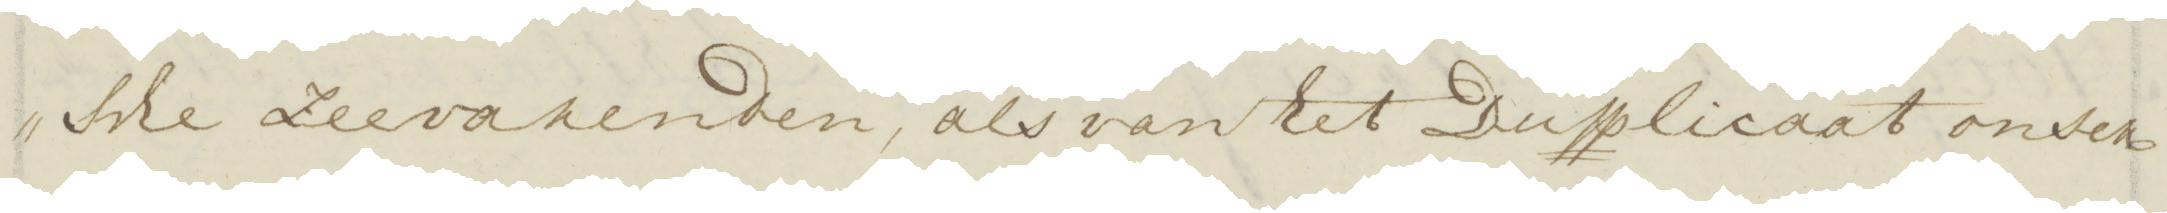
„sche zeevarenden, als van het Dupplicaat onser
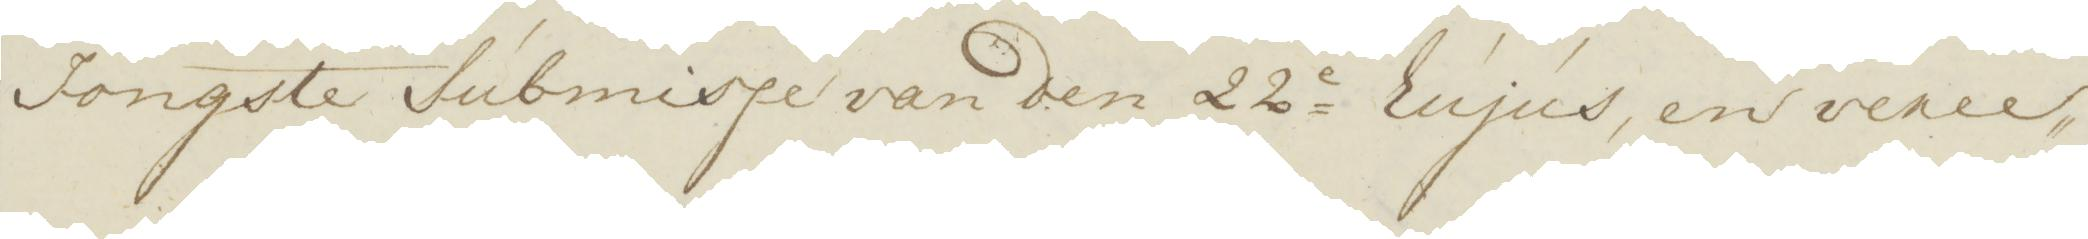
Jongste submisse van den 22=e hujus, en veree„
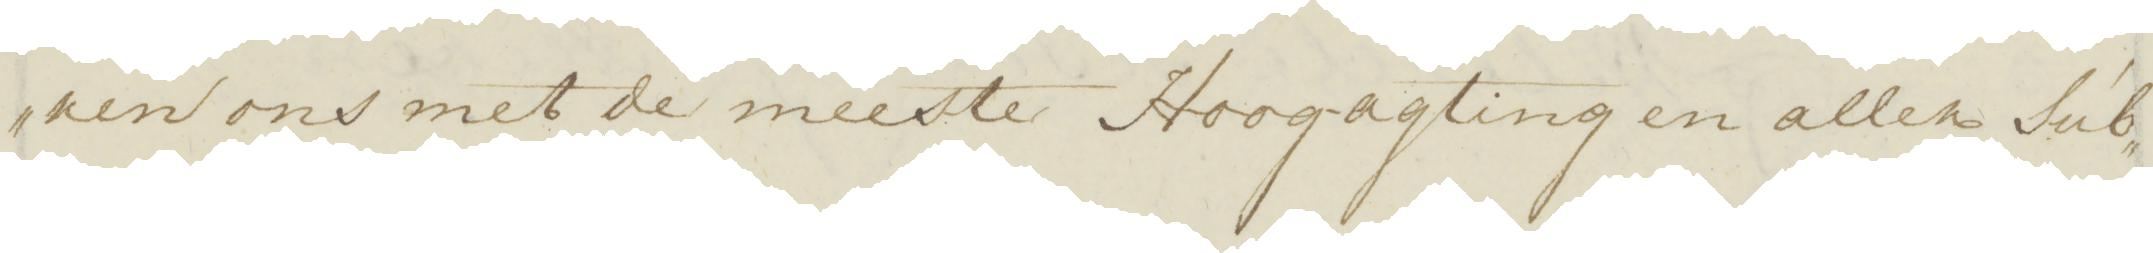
„ren ons met de meeste Hoogagting en aller sub„
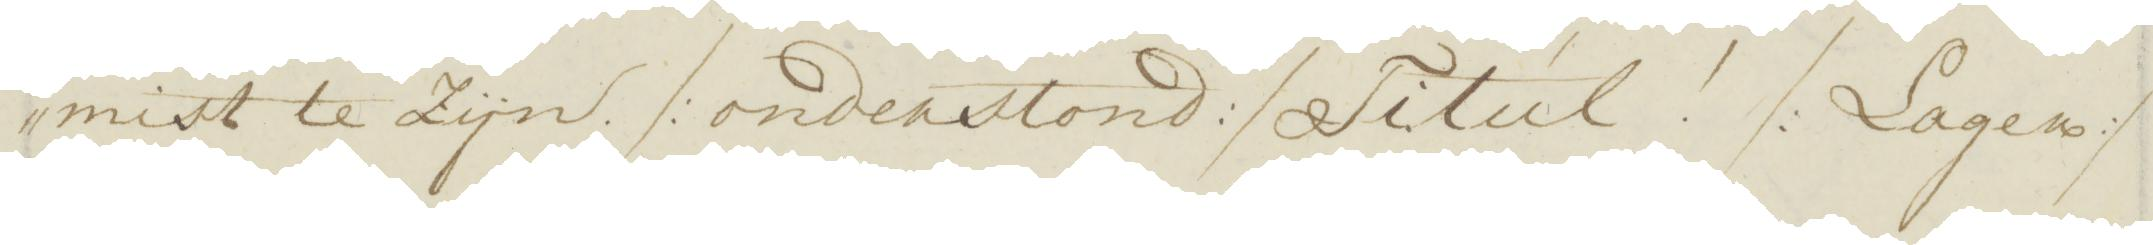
„mist te zijn. /:onderstond:/ Titul ! /:Lager:/
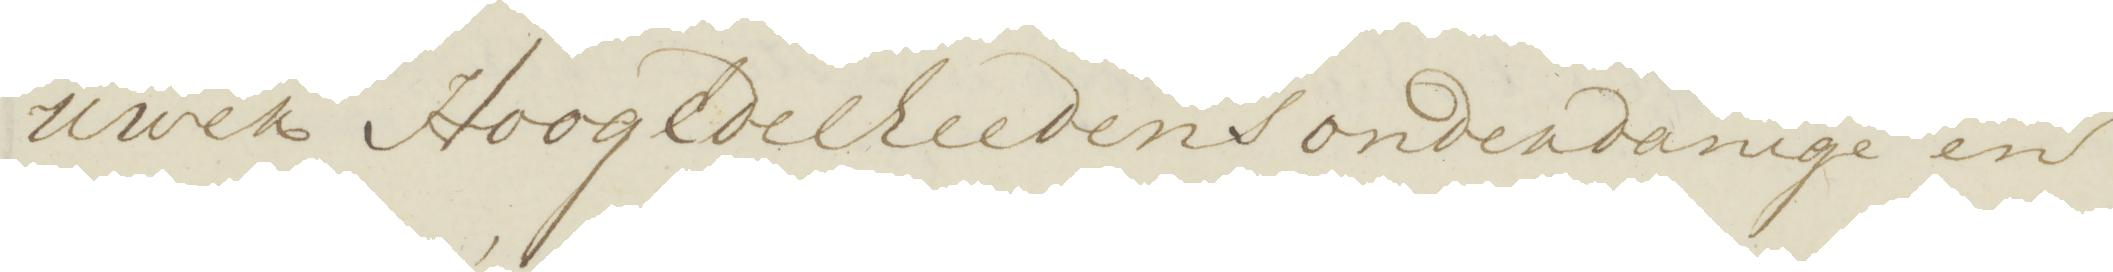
uwer Hoog Edelheedens onderdanige en
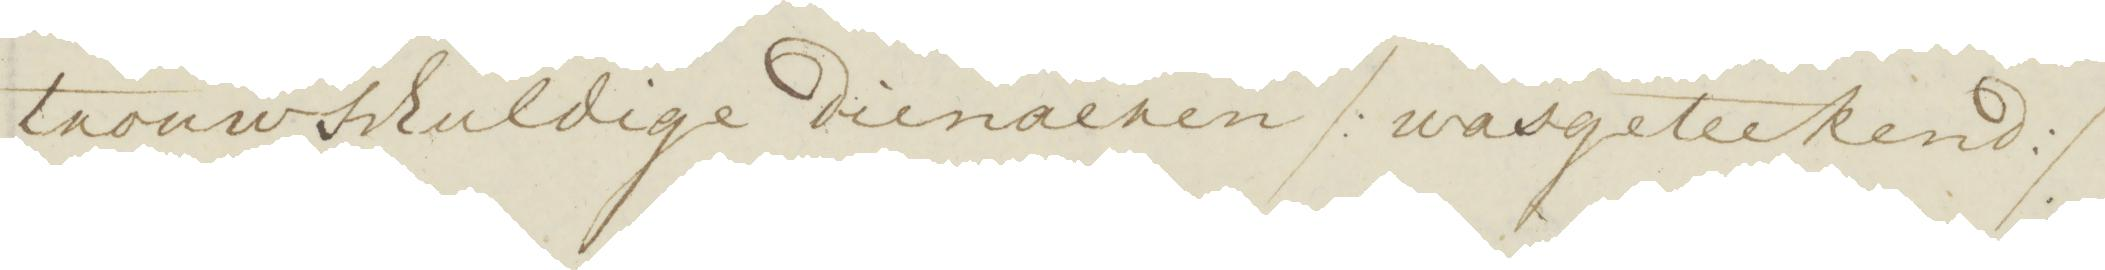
trouwschuldige dienaeren /:was geteekend:/
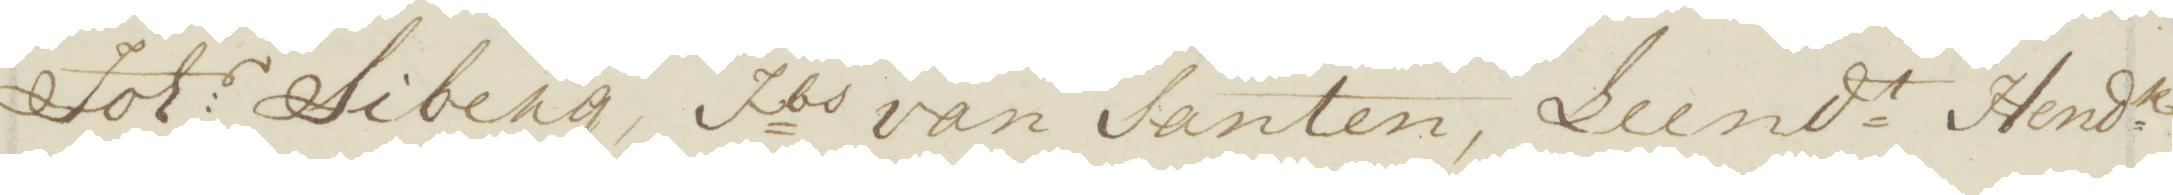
Joh:s Siberg, J=bs van santen, Leend=t Hend=k
